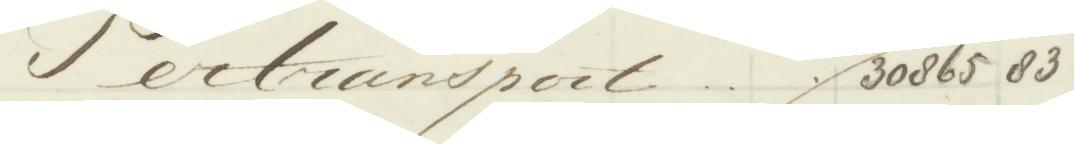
Pertransport . . ƒ30865 83
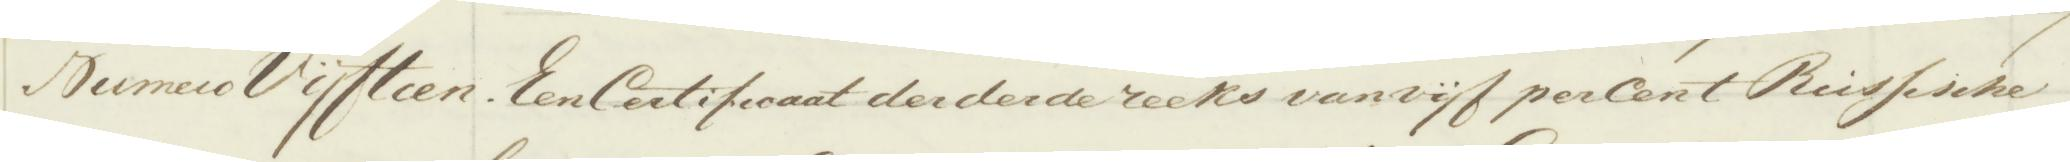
Numero Vijftien. Een Certificaat der derde reeks van vijf percent Russische
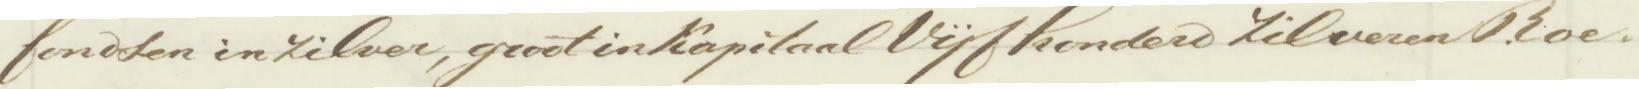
fondsen in zilver, groot in Kapitaal Vijf honderd zilveren Roe„
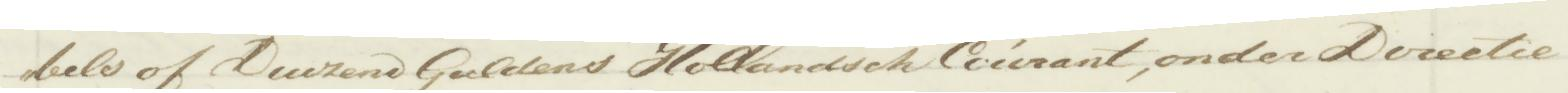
„bels of Duizend Guldens Hollandsch Courant, onder Directie
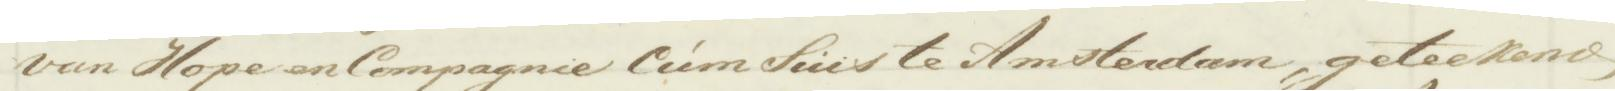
van Hope en Compagnie Cum Suis te Amsterdam, geteekend
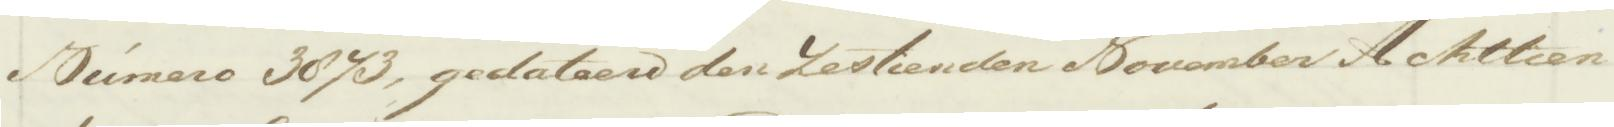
Numero 3873, gedateerd den Zestienden November Achttien
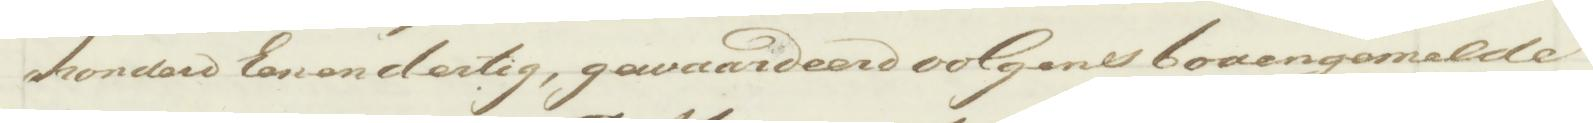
honderd Een en dertig, gewaardeerd volgens bovengemelde
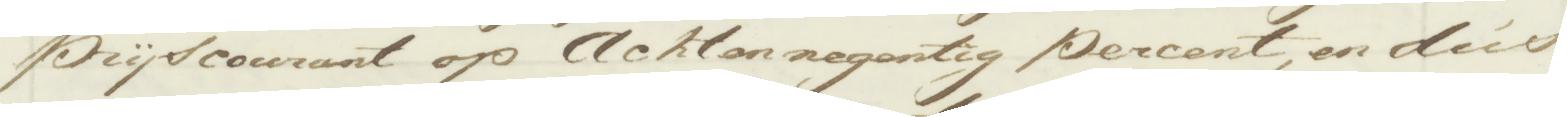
Prijscourant op Acht en negentig Percent, en dus
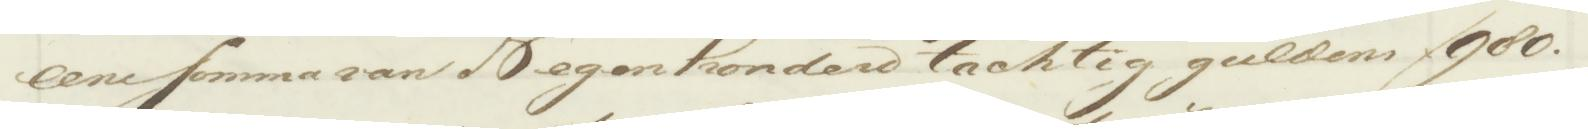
eene somma van Negenhonderd tachtig guldens ƒ980.
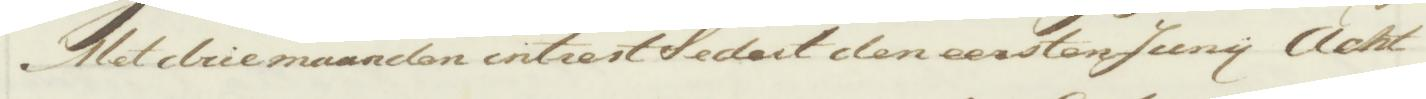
Met drie maanden intrest sedert den eersten Junij Acht
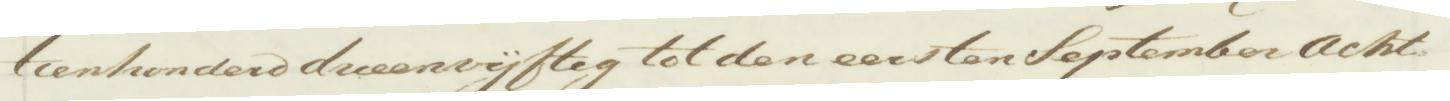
tienhonderd drieenvijftig tot den eersten September Acht
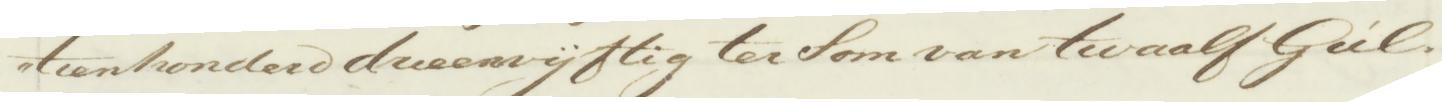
„tienhonderd drieenvijftig ter som van twaalf Gul.
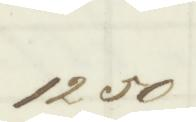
1250
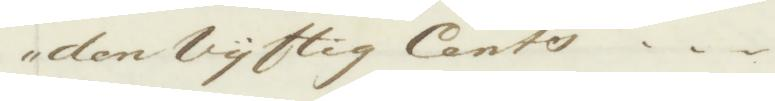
„den vijftig Cents - - -
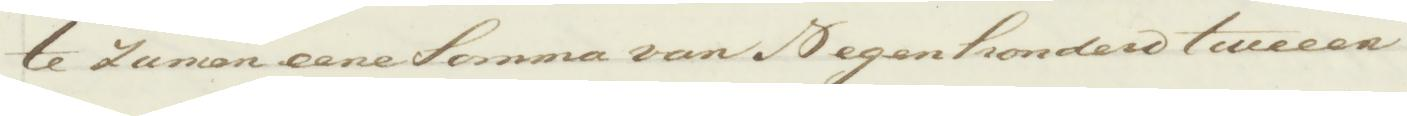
te zamen eene somma van Negenhonderd tweeen
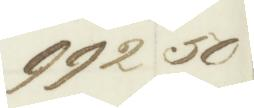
992 50
